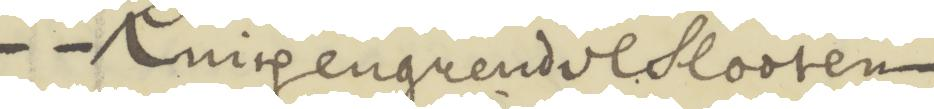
– – Knip en grendelslooten
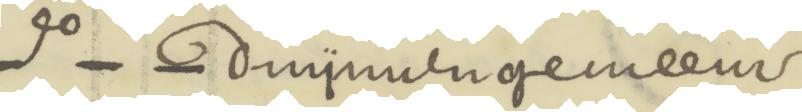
_o – – duimen gemeen
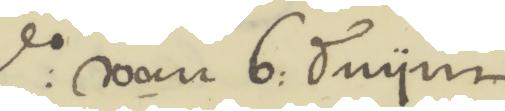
_o: van 6: duijm
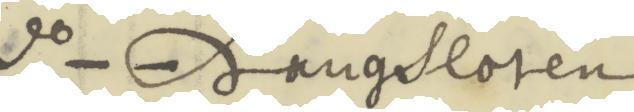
_o – – Hangsloten
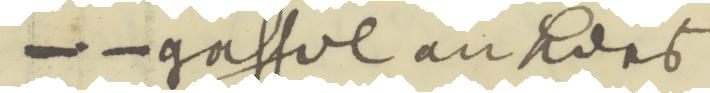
– – gaffel ankers
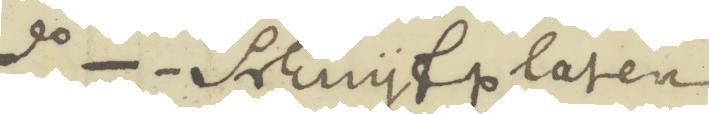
_o – – schuijfplaten
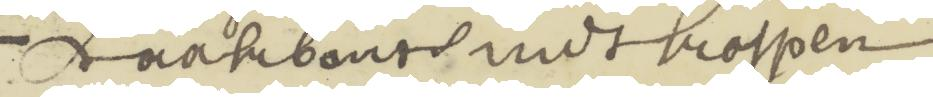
Haakbouts met koppen
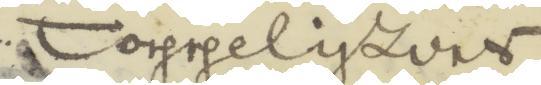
. Coppelijzers
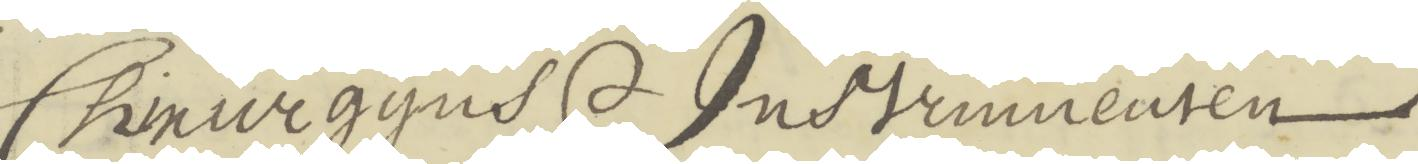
Chrurgijns Instrumenten
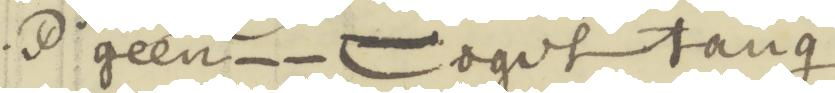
Ps geen – – Cogeltang
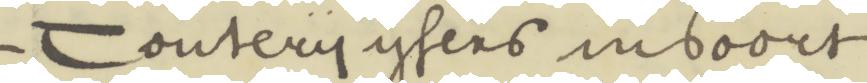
Conterij ijsers in soort
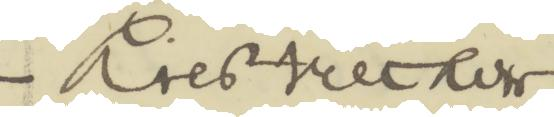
– Kiestrecker
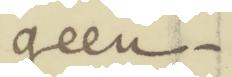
geen –
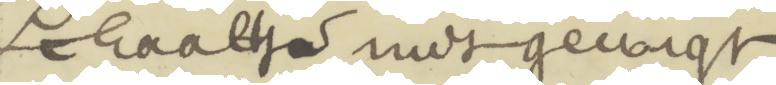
schaaltje met gewigt
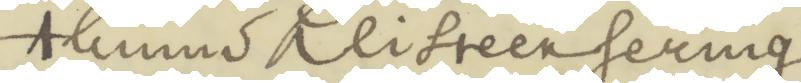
thinne Klisteersering
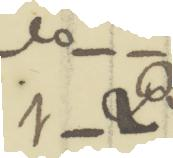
1 – Ps
